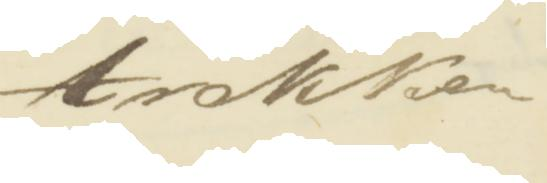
trekken
